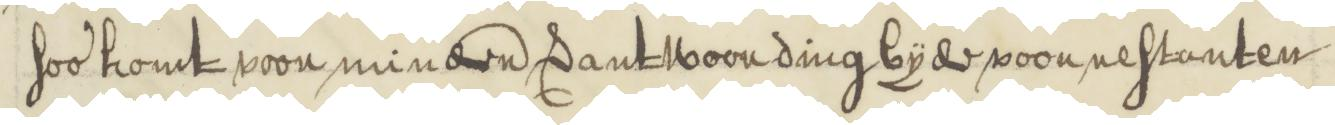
Soo komt voor minder verantwoording bij de voor restanten
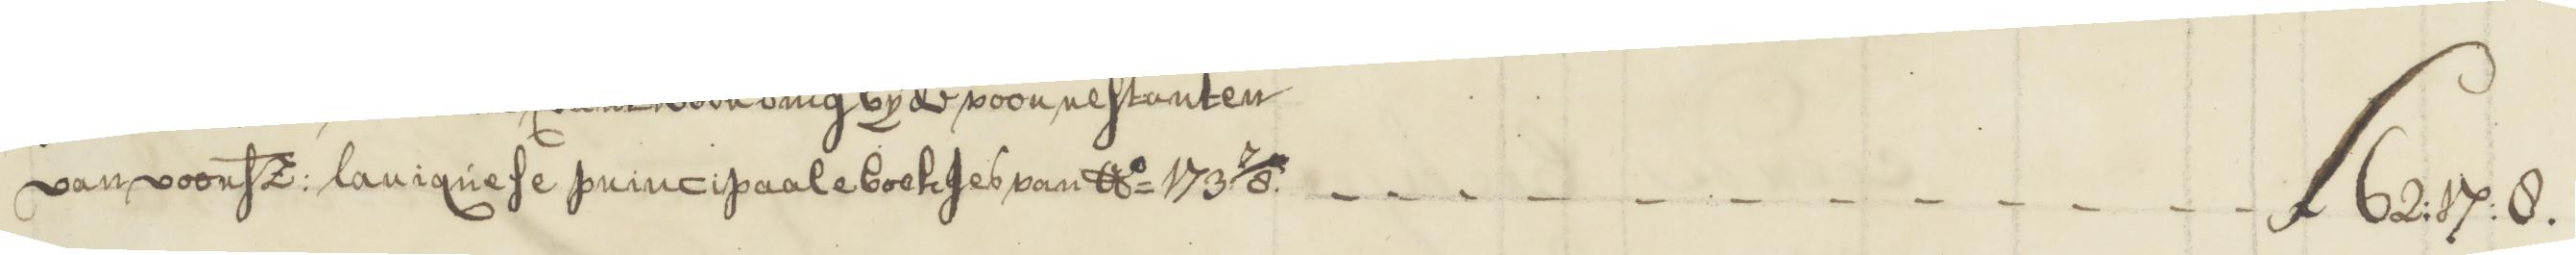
van voorsz: lariquese principaale boekjes van A=o 1737/en8. - - - - - - - - - - - - - ƒ 62: 17: 8.
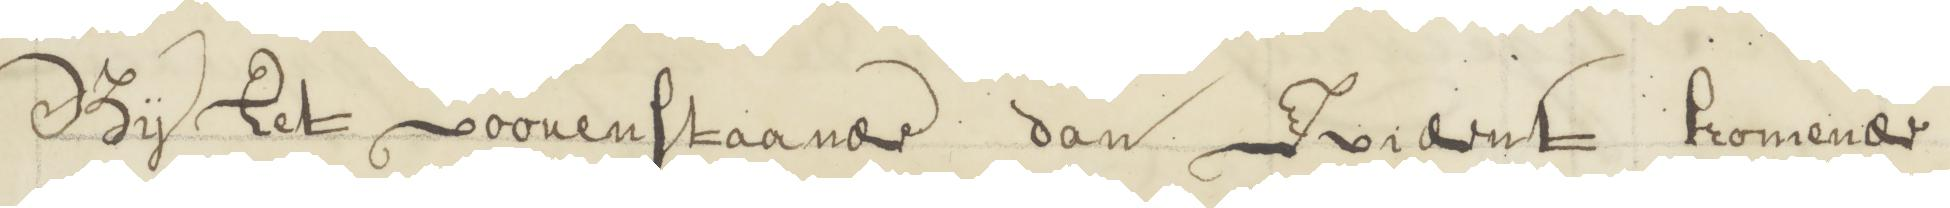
Bij het voorenstaande dan Evident komende
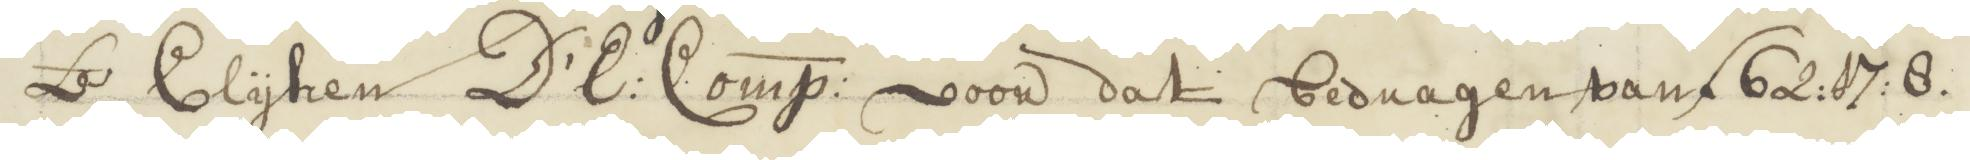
te blijken D' E: Comp: voor dat bedragen van ƒ 62: 17: 8.
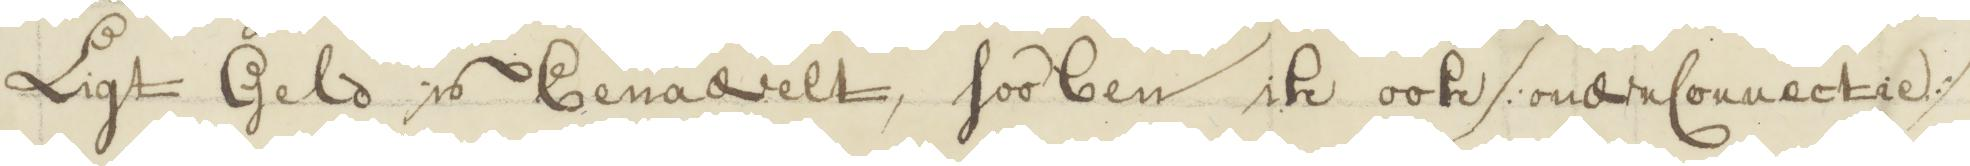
Ligt Geld is benadeelt, Soo ben ik ook /:onder correctie:/
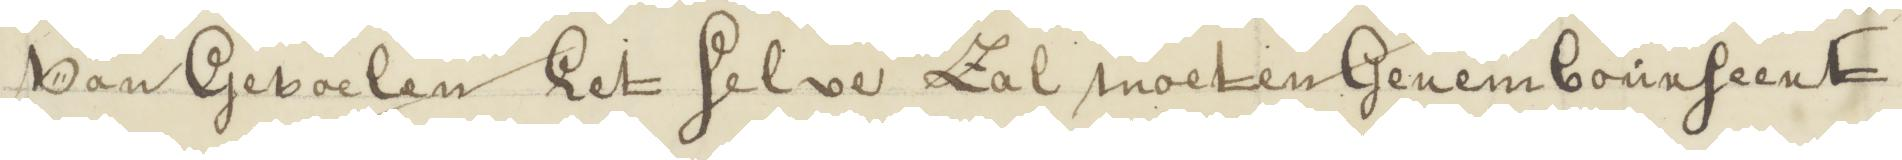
van Gevoelen het selve Zal moeten Gerembourseert
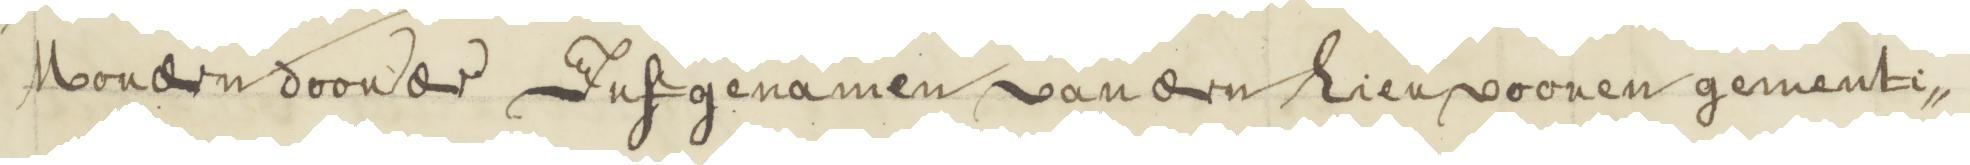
worden door de Erfgenamen van den hier vooren gementi„
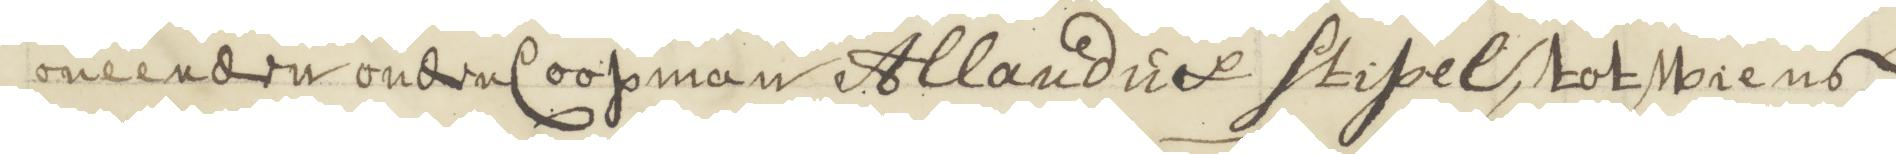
oneerden ondercoopman Allardus Stipel, tot Wiens
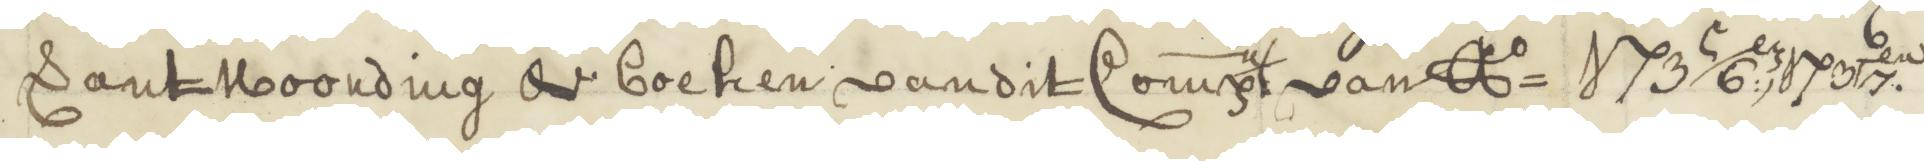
verantwoording de boeken van dit Comp:t van A=o 173 5/en6:, 173 6/en7.
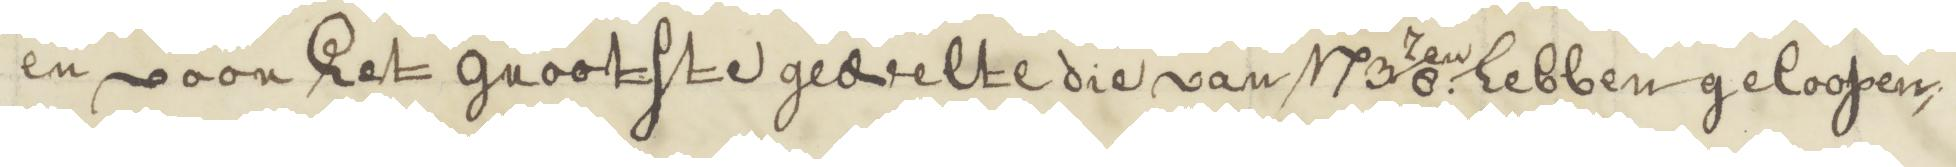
en voor het grootste gedeelte die van 173 7/en8: hebben geloopen;
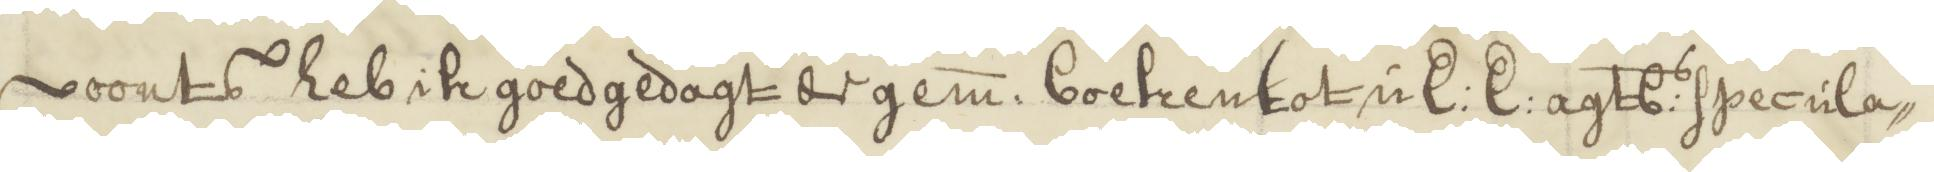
voorts heb ik goed gedagt de gem: boeken tot uE: E: agtb:s Specula„
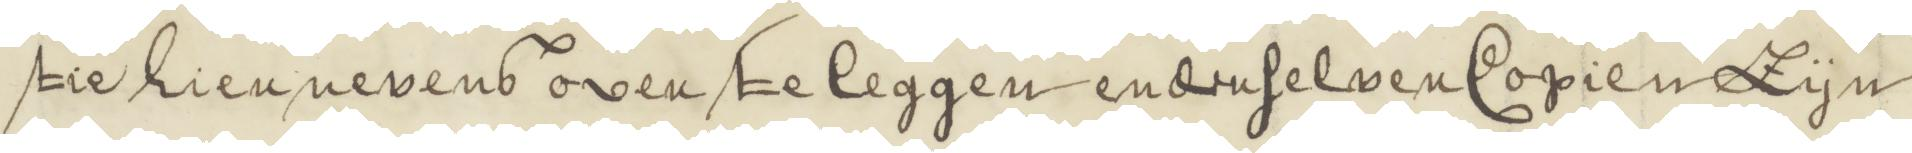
tie hier nevens over te leggen en derselver Copien Zijn
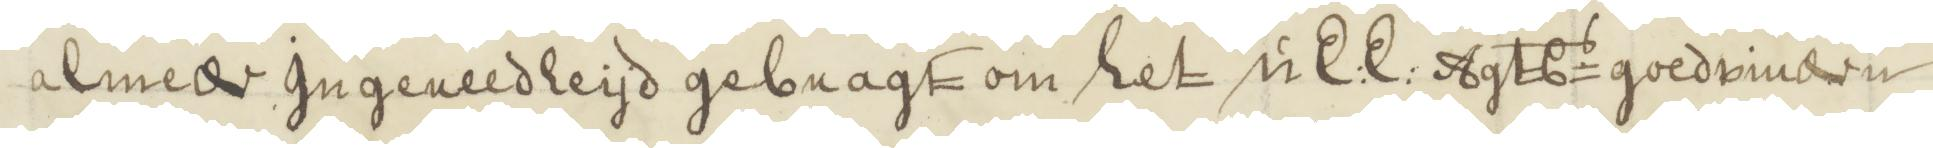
almede jn gereedheijd gebragt om het uE:E: Agtb=s goedvinden
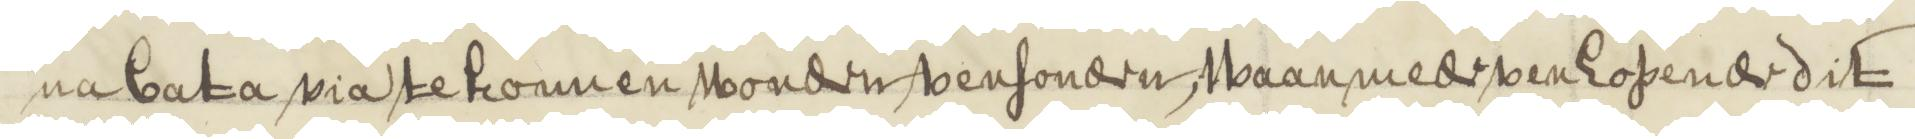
na batavia te konnen worden versonden, waarmede verhopende dit
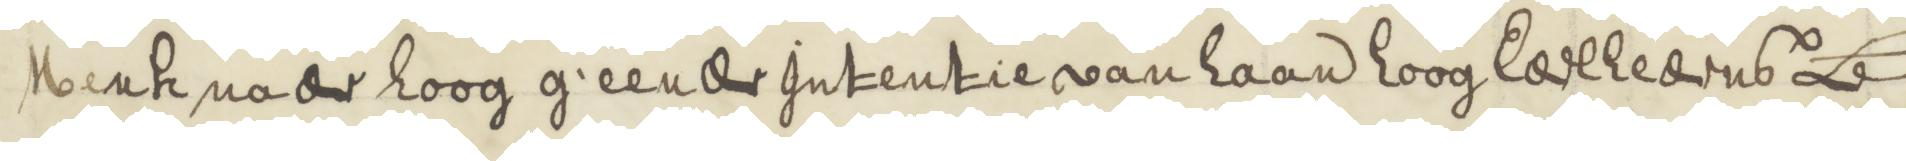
Werk na de hoog g’eerde jntentie van haar hoog Edelhedens te
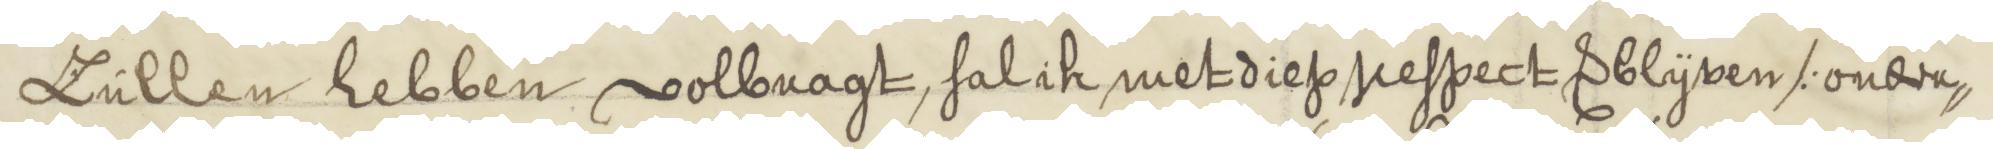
Zullen hebben volbragt, sal ik met diep respect verblijven /:onder„
